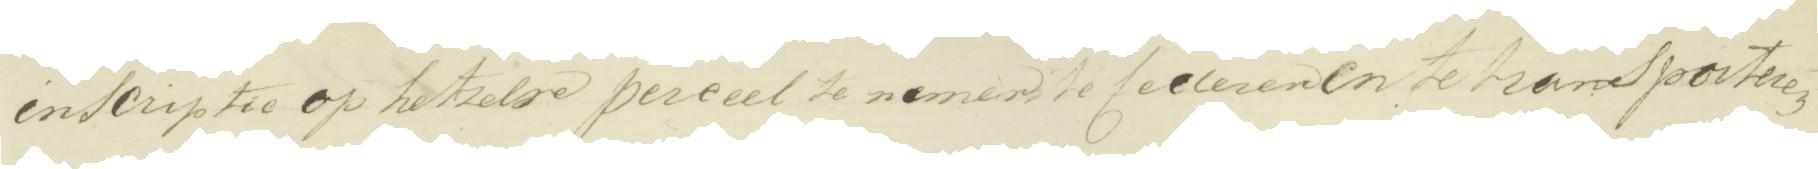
inscriptie op hetzelve perceel te nemen te Cederen en te transporteren„
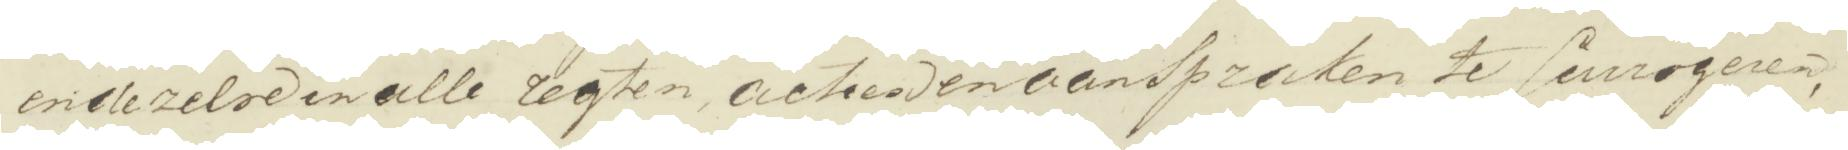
en dezelve in alle regten, actien en aanspraken te Surrogeren,
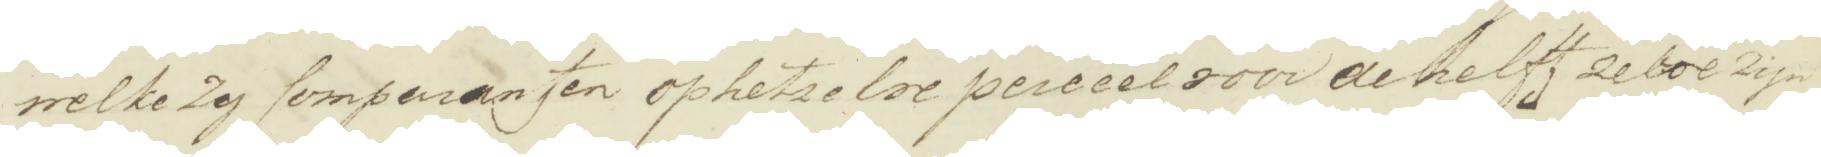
welke zy Comparanten op hetzelve perceel voor de helft zelve zijn
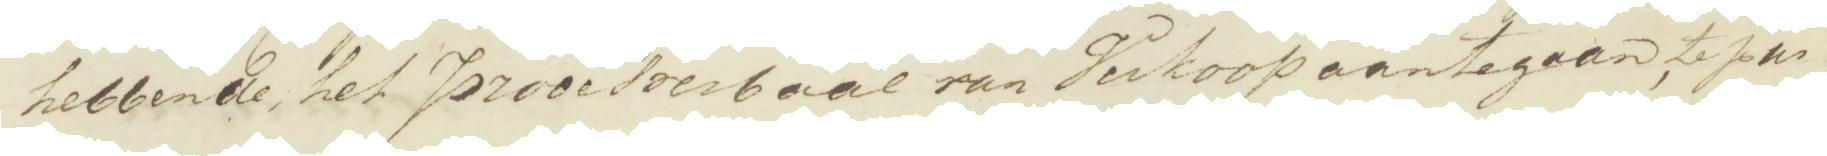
hebbende, het Procesverbaal van Verkoop aan te gaan, te pas
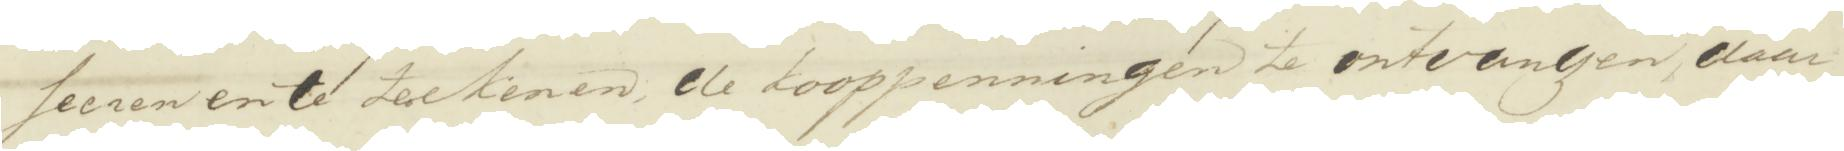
Seeren en te teekenen, de kooppenningen te ontvangen, daar
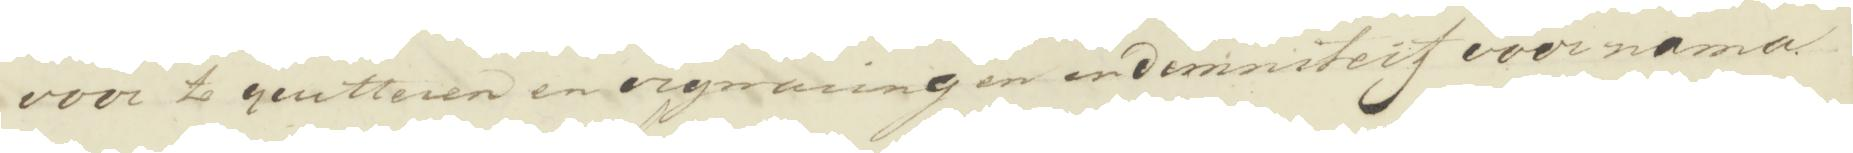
voor te quitteren en vrywaring en indemniteit voor nama
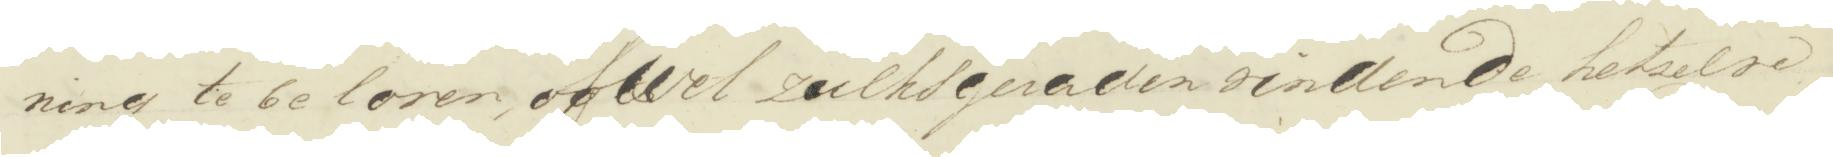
ning te beloven, of wel zulks geraden vindende hetzelve
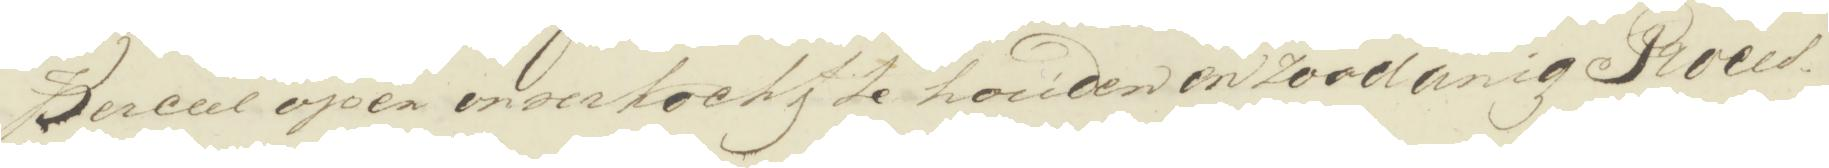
Perceel op en onverkocht te houden en zoodanig Proces
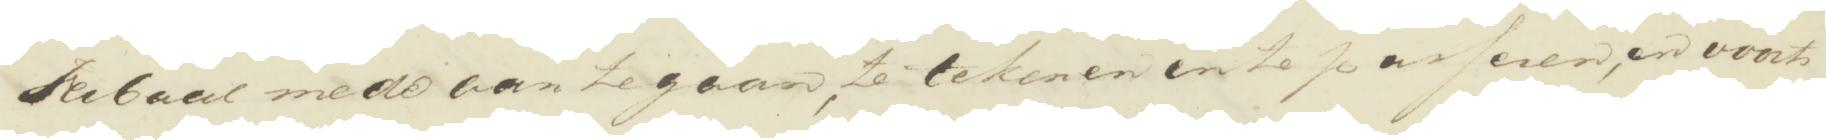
Verbaal mede aan te gaan, te tekenen en te passeren, en voorts
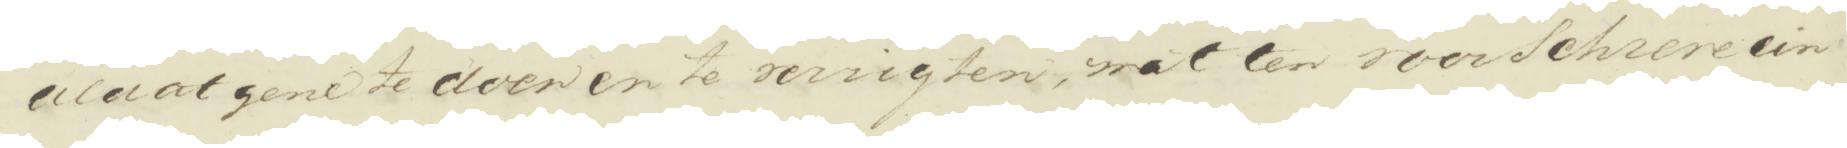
al datgene te doen en te verrigten, wat ten voorschreve ein
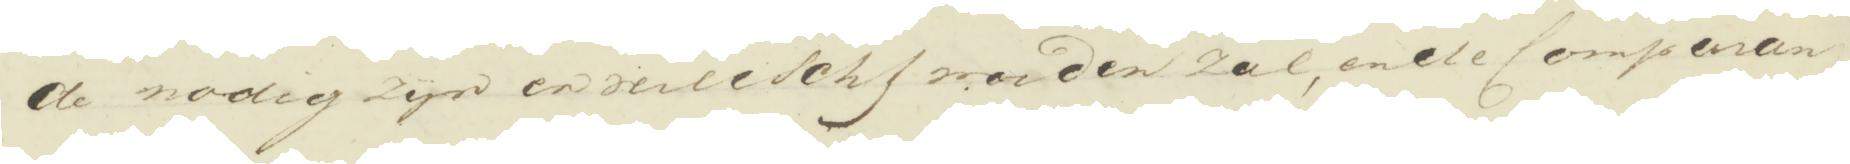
de nodig zijn en vereischt worden zal, en de Comparan
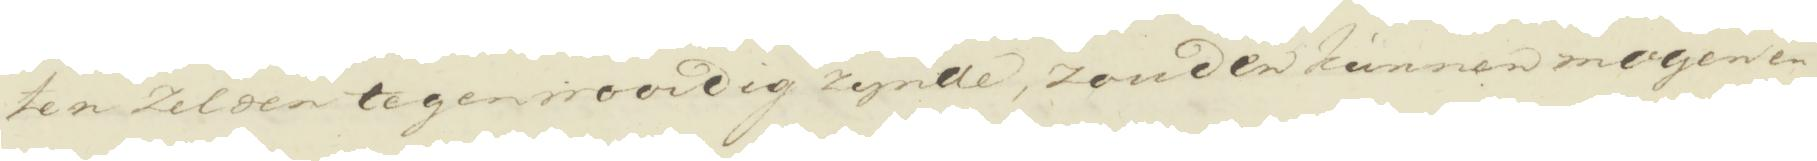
ten zelven tegenwoordig zynde, zouden kunnen mogen en
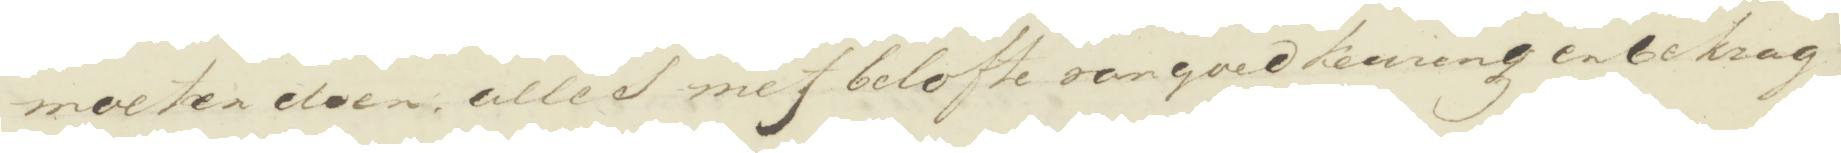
moeten doen, alles met belofte van goedkeuring en bekrag
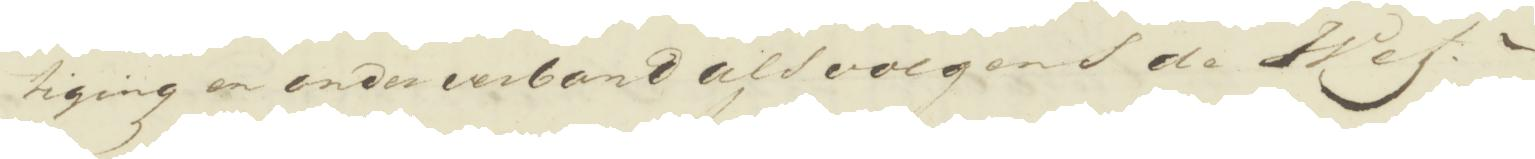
tiging en onder verband als volgens de Wet.
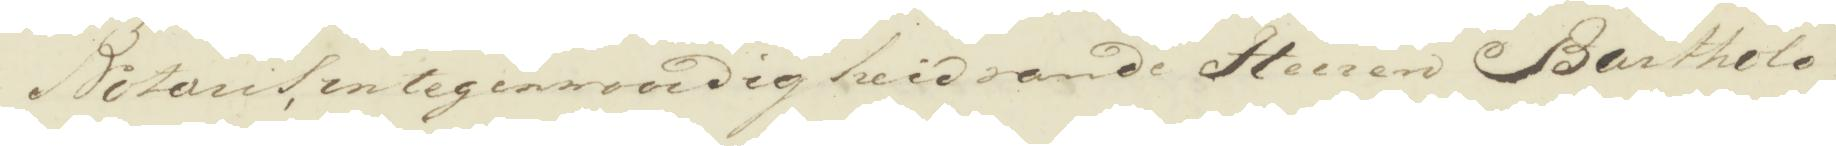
Notaris in tegenwoordigheid van de Heeren Bartholo
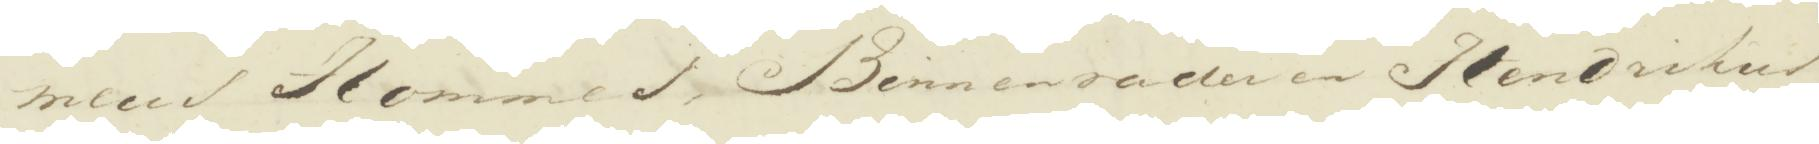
meus Hommes Binnenvader en Hendrikus
